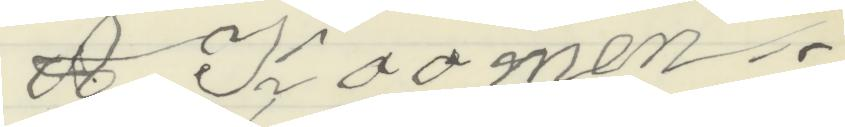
A. Koomen
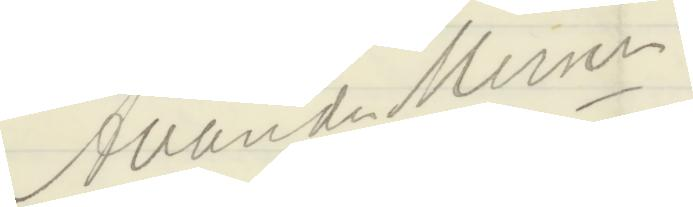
A van den Mersch
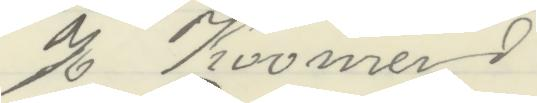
J Koomen
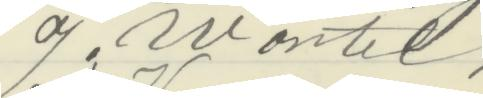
J. Wortel
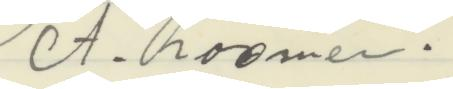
A. Koomen.
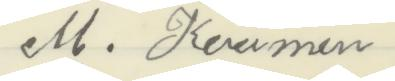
M. Koomen
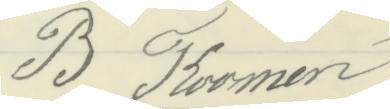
B Koomen
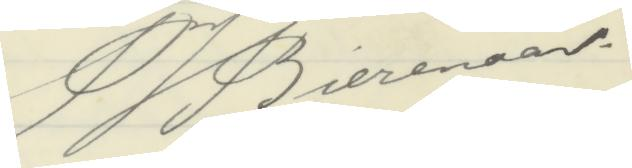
PJBiezenaar.
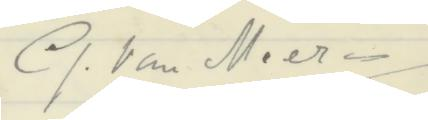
G. van Mier
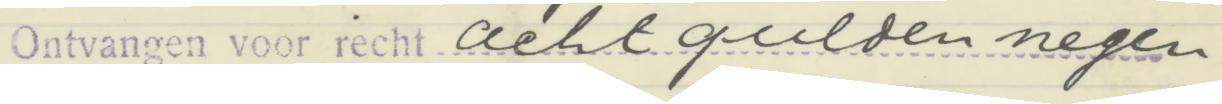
acht gulden negen
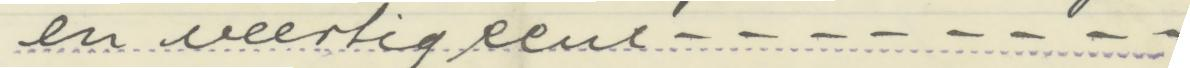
en veertig cent – – – – – – – –
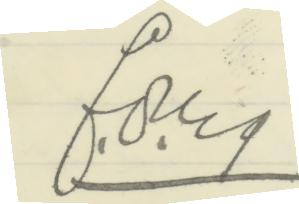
ƒ.8.49
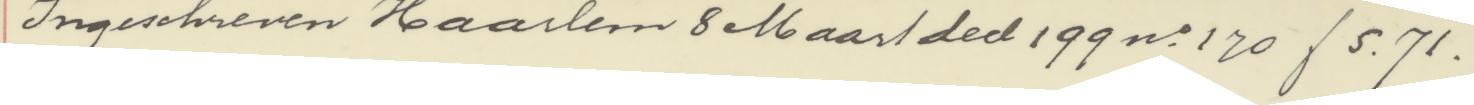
Ingeschreven Haarlem 8 Maart deel 199 n.o 170 ƒ 5.71.
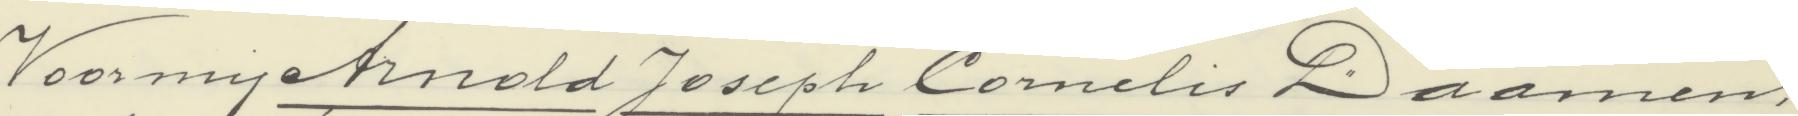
Voor mij Arnold Joseph Cornelis Daamen,
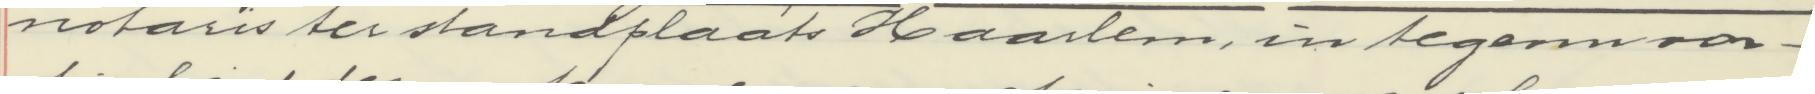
notaris ter standplaats Haarlem, in tegenwoor-
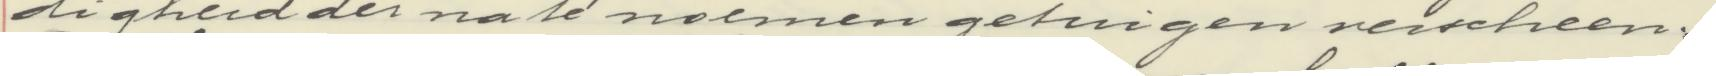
digheid der na te noemen getuigen verscheen:
